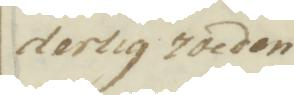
dertig roeden
